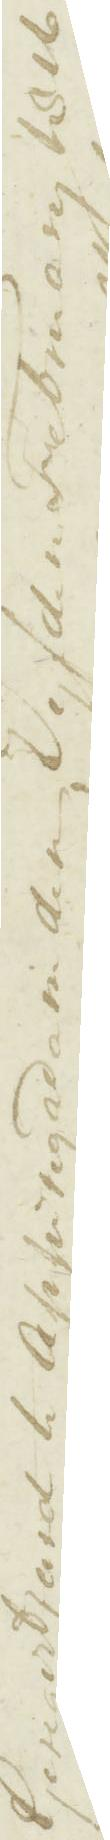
Geregistreerd te Appingadam den Vyfden February 1816
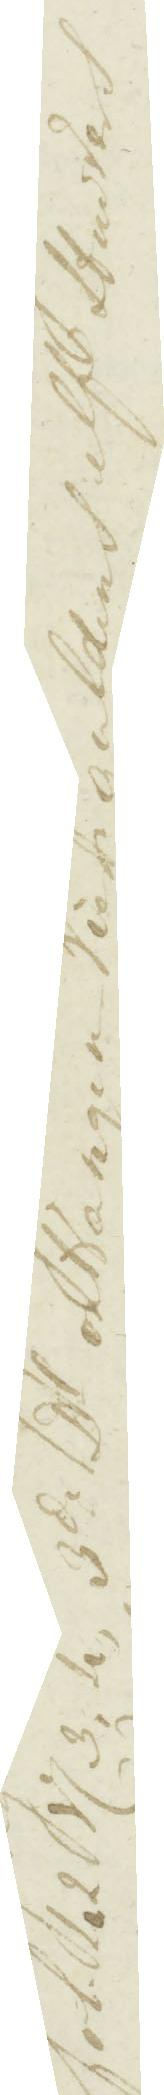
fol. 42 V 3, 4, 3dl ontvangen Vier guldens elf stuivers
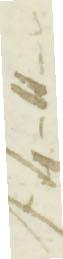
ƒ 4 - 11 -
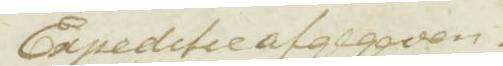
Expeditie afgegeven
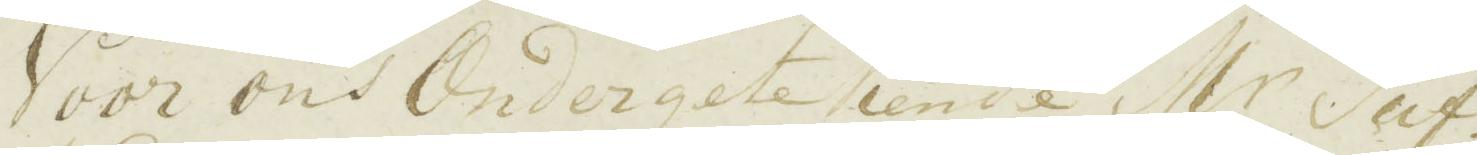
Voor ons Ondergetekende Mr Suf.
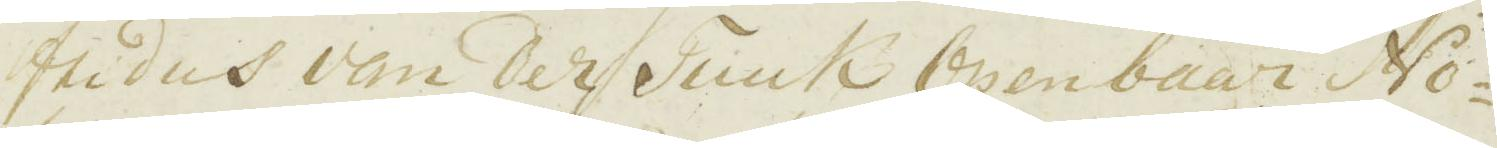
fridus van der Tuuk Openbaar No=
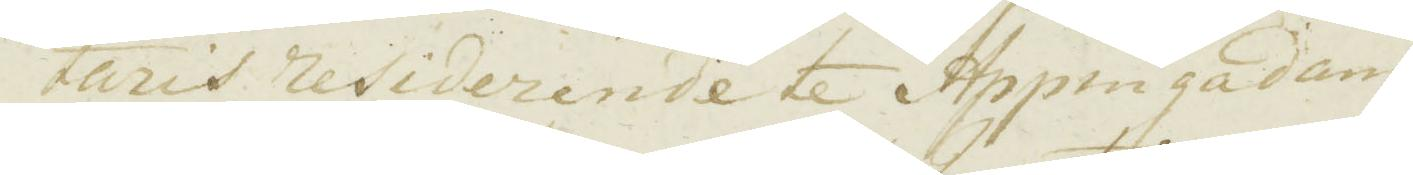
taris residerende te Appingadam
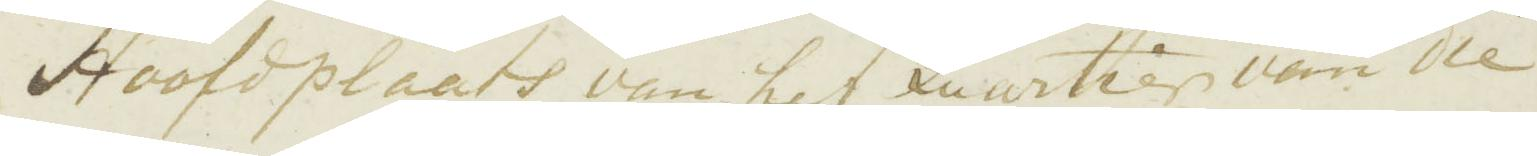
Hoofdplaats van het kwartier van die
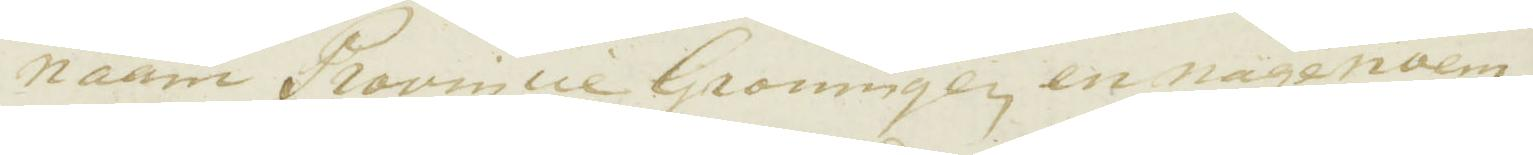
naam Provincie Groningen en nagenoem
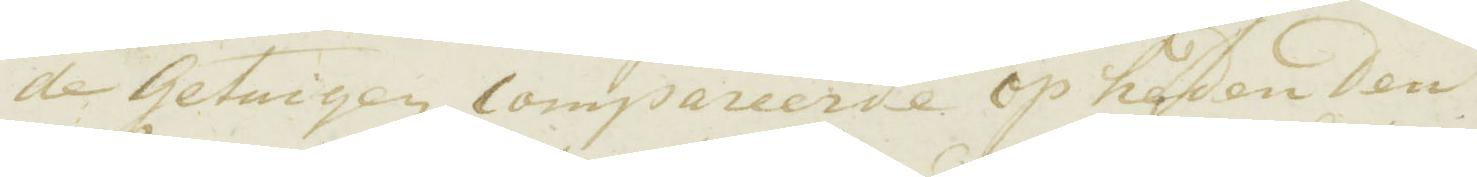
de Getuigen compareerde op heden den
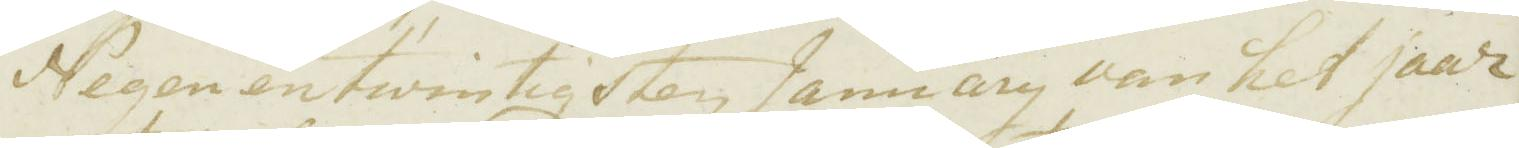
Negen en twintigsten January van het Jaar
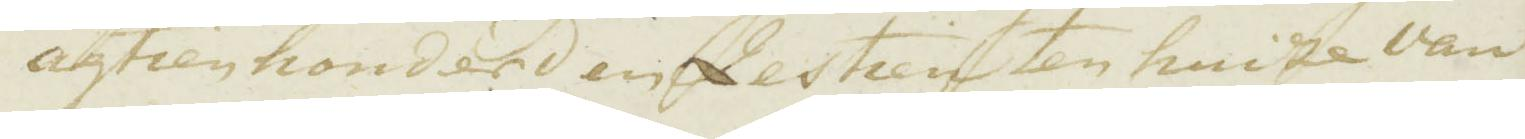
agtien honderd en zestien ten huize van
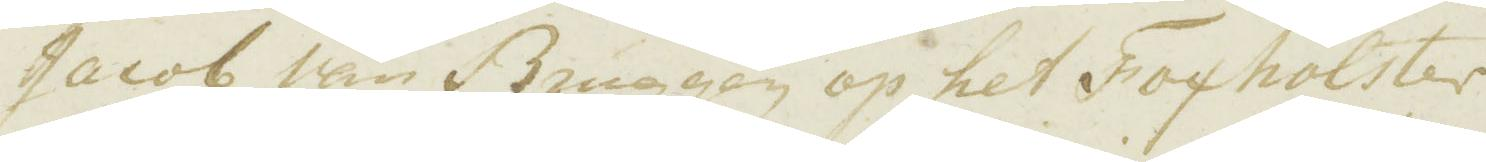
Jacob van Bruggen op het Foxholster
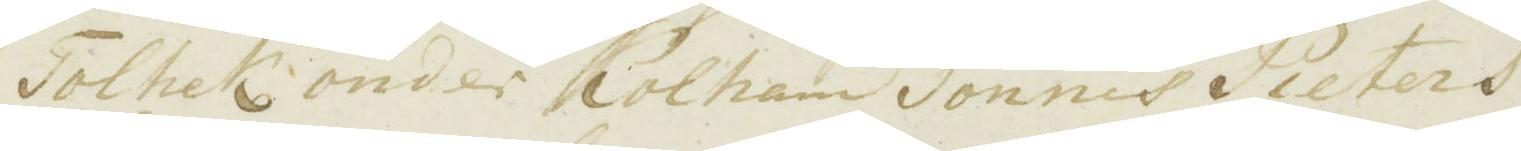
Tolhek onder Kolham Tonnis Pieters
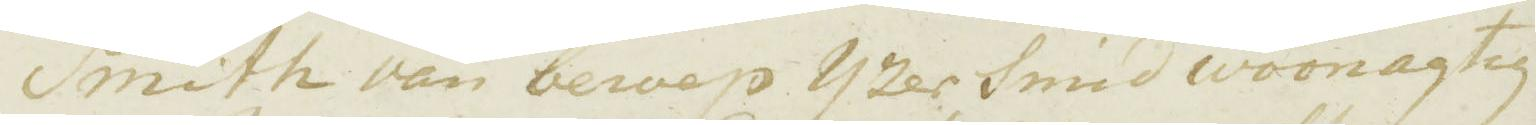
Smith van beroep IYzer smid woonagtig
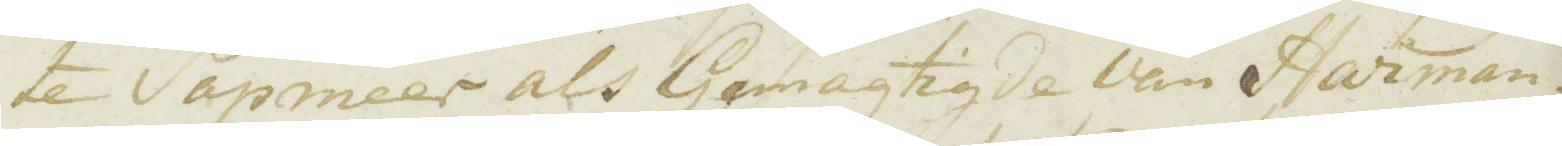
te Sapmeer als Gemagtigde van Harman
